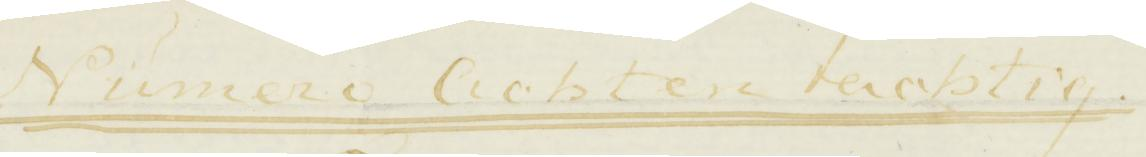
Numero Achten tachtig.
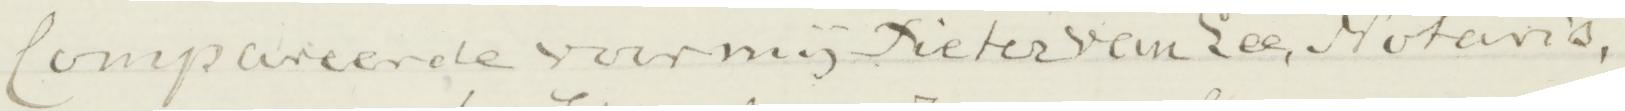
Compareerde voor mij Pieter van Lee Notaris,
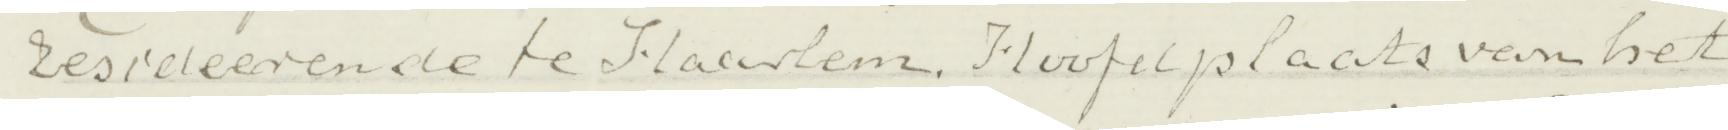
resideerende te Haarlem, Hoofdplaats van het
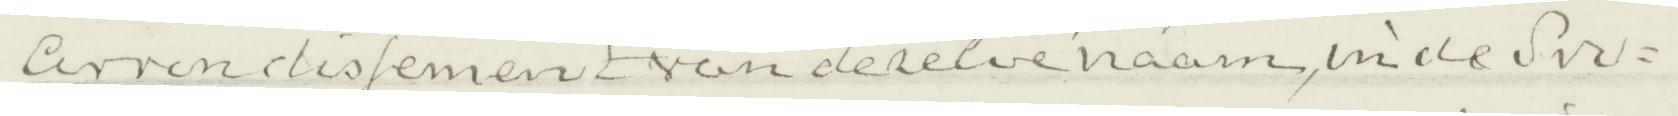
Arrondissement van dezelve naam, in de Pro=
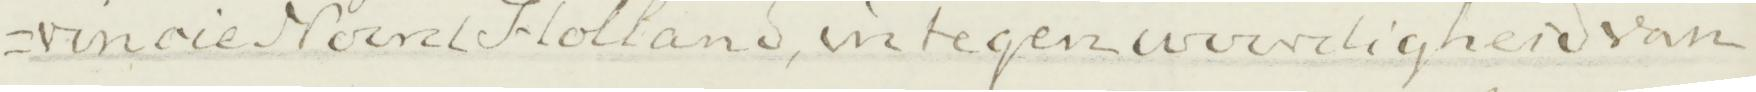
=vincie Noord Holland, in tegenwoordigheid van
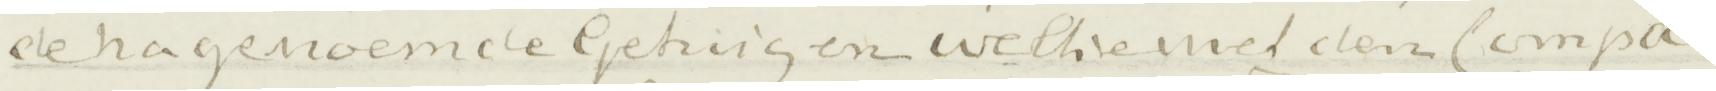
de nagenoemde Getuigen welke met den Compa=
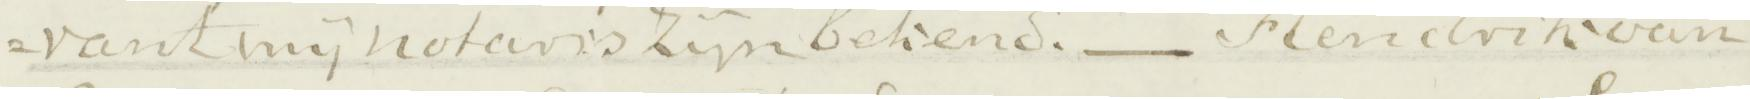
=rant mij notaris zijn bekend. — Hendrik van
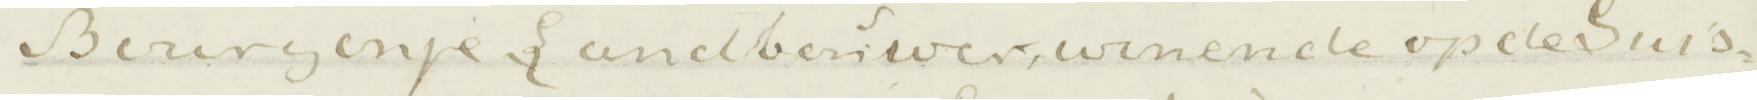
Bourgonje Landbouwer, wonende op de huis
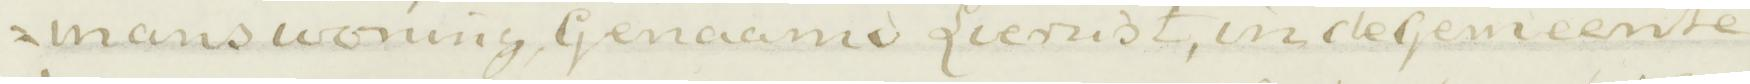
=mans woning, Genaamd Lierust, in de Gemeente
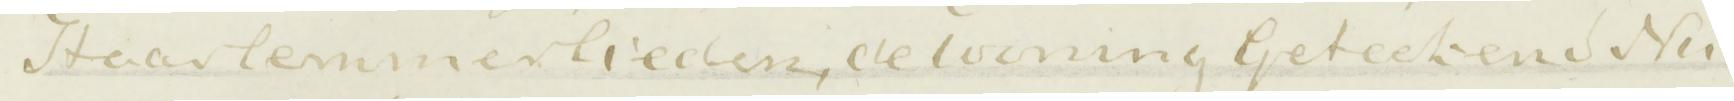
Haarlemmerlieden, de woning Geteekend Nu
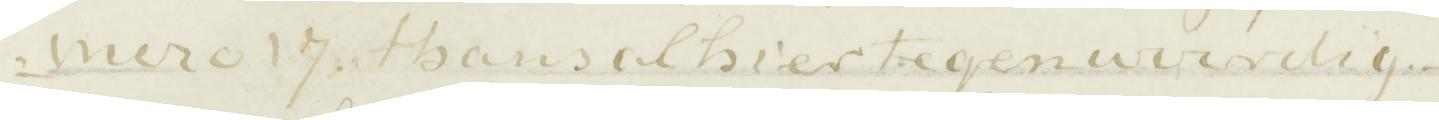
=mero 17. thans alhier tegenwoordig.
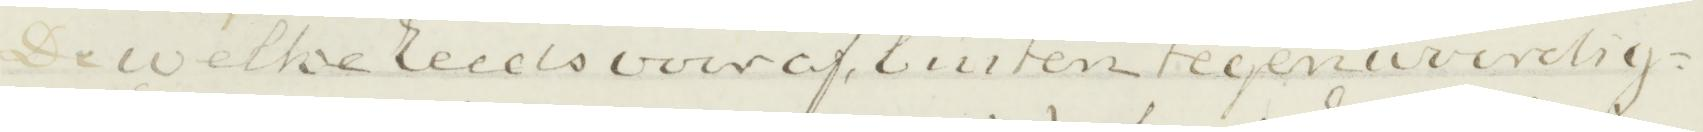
De welke Reeds vooraf, buiten tegenwoordig=
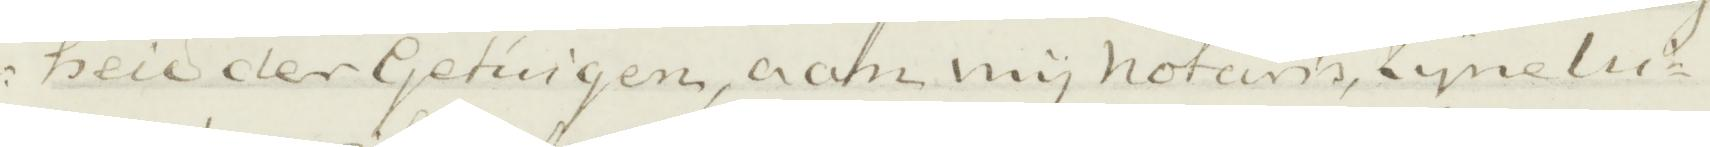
=heid der Getuigen, aan mij notaris, zijne ui=
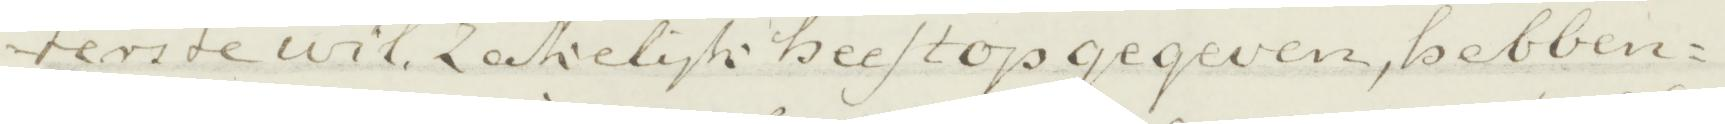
=terste wil zakelijk heeft opgegeven, hebben=
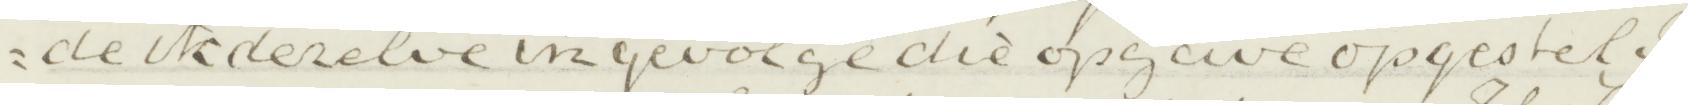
=de ik dezelve in gevolge die opgave opgesteld,
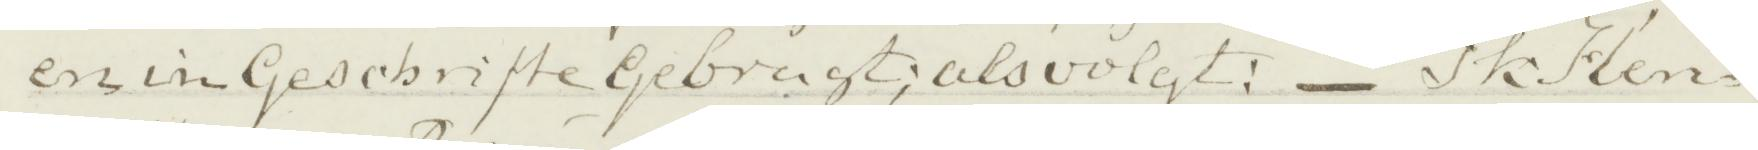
en in Geschrifte Gebragt; als volgt: — Ik Hen=
